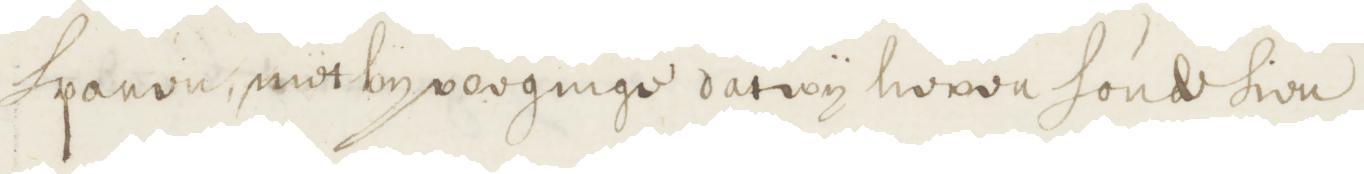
sparen, met bijvoeginge dat wij liever soude sien
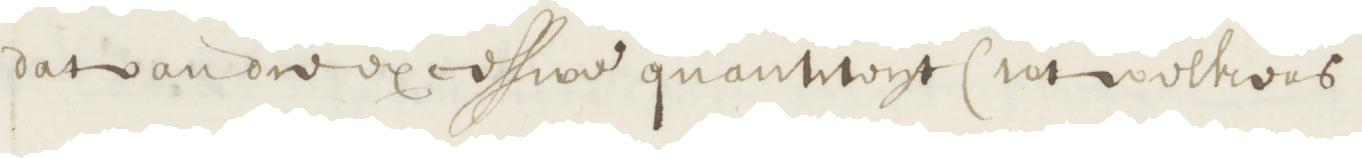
dat van die excessive quantiteijt (tot welkers
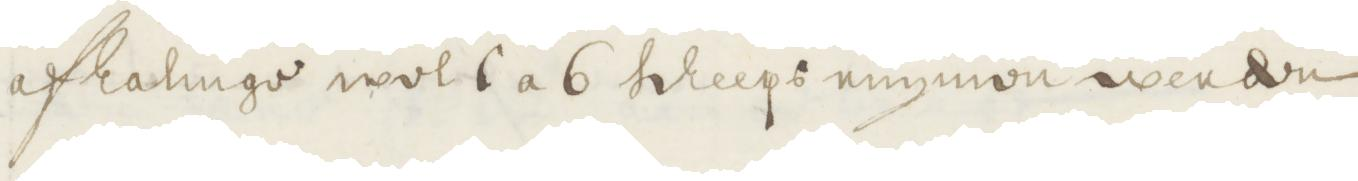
afhalinge wel 5 a 6 scheeps ruijmen werden
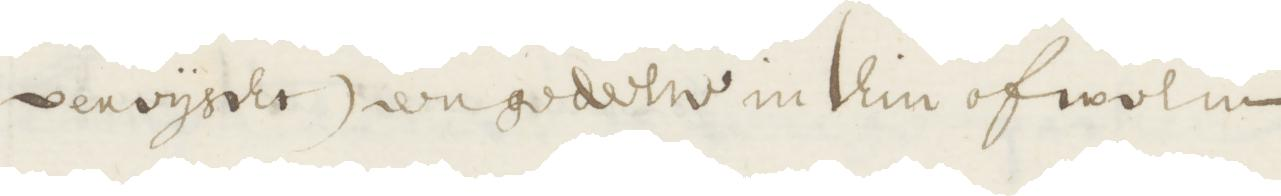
vereijscht) een gedeelte in thin of wel in
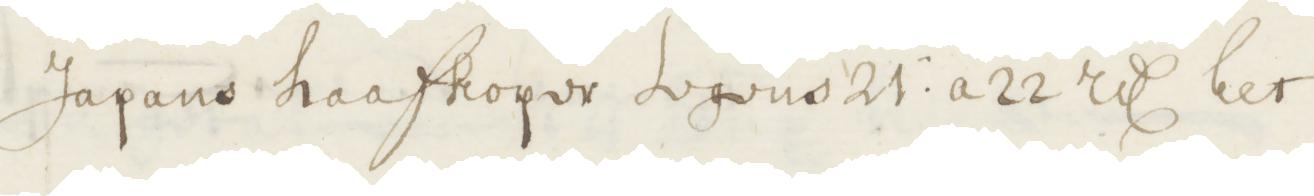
Japans staafkoper tegens 21 a 22 re het
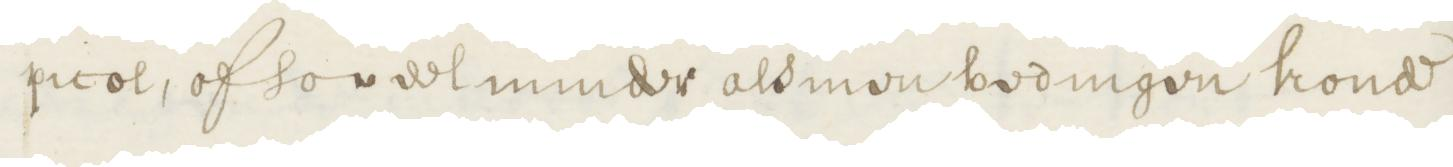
picol, ofso veel minder als men bedingen konde
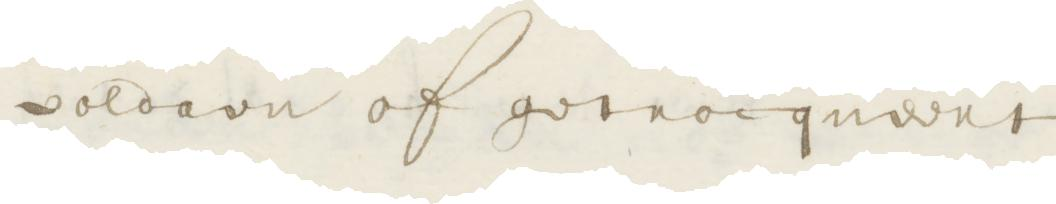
voldaen of getrocqueert
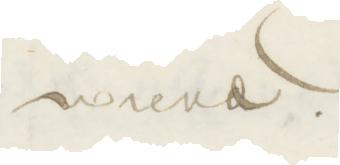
wierd.
